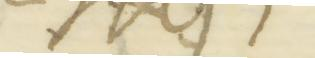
3195
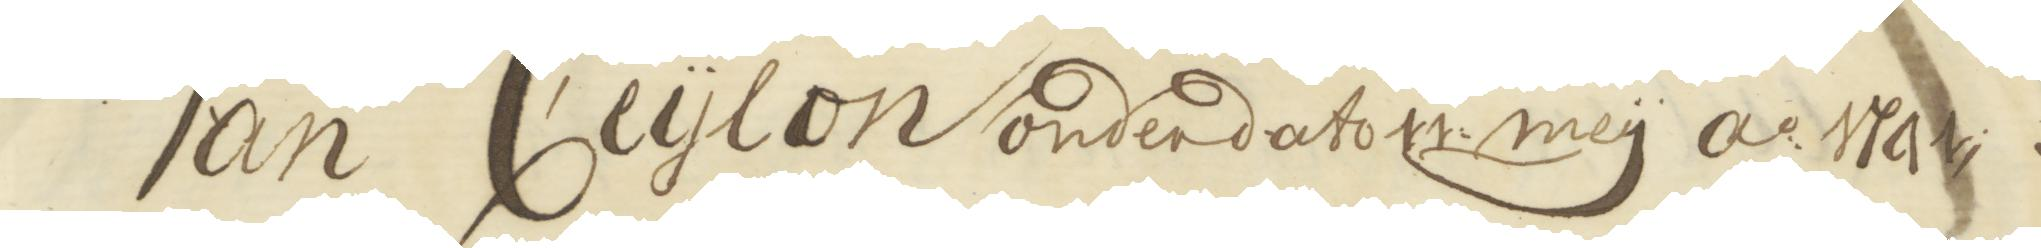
Van Ceijlon onder dato 11: meij a:o 1741;
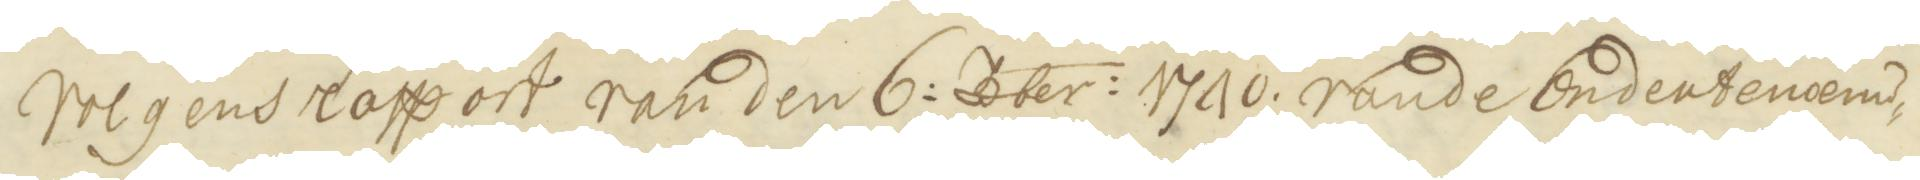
volgens rapport van den 6: 7ber: 1740. van de ondertenoeme„
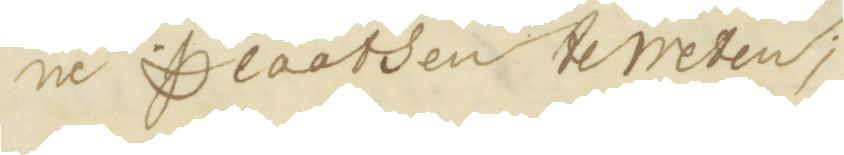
ne plaatsen te weten;
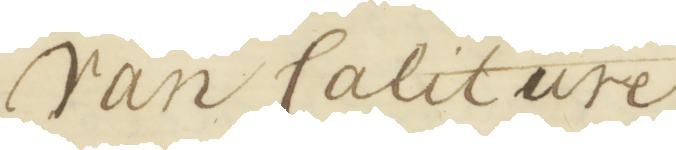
van Caliture
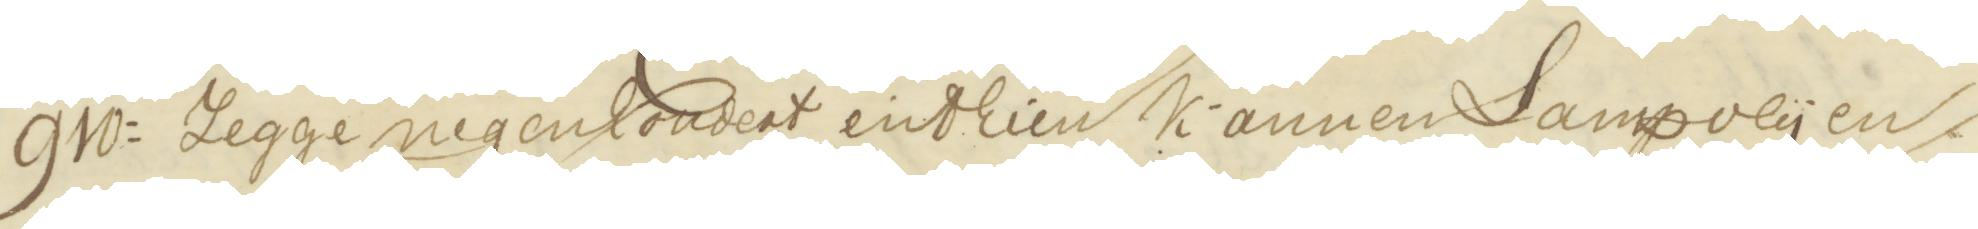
910: zegge negenhondert enthien kannen Lampolij en
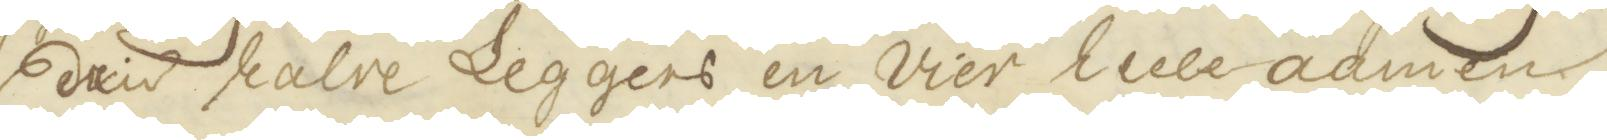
drie halve leggers en vier heele aamen
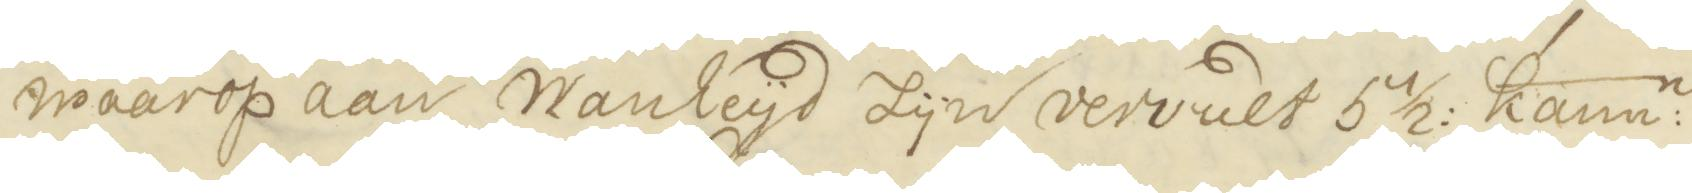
waarop aan wanheijd zijn vervult 5½: kann:n
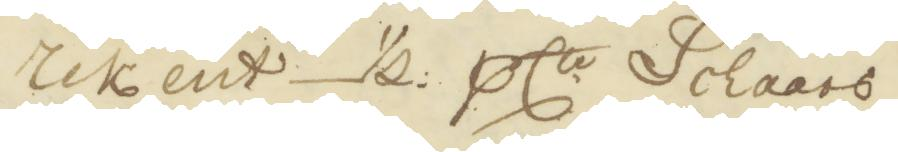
rekent ½: pC:to Schaars
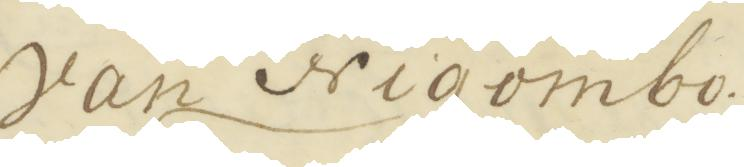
Van Nigombo.
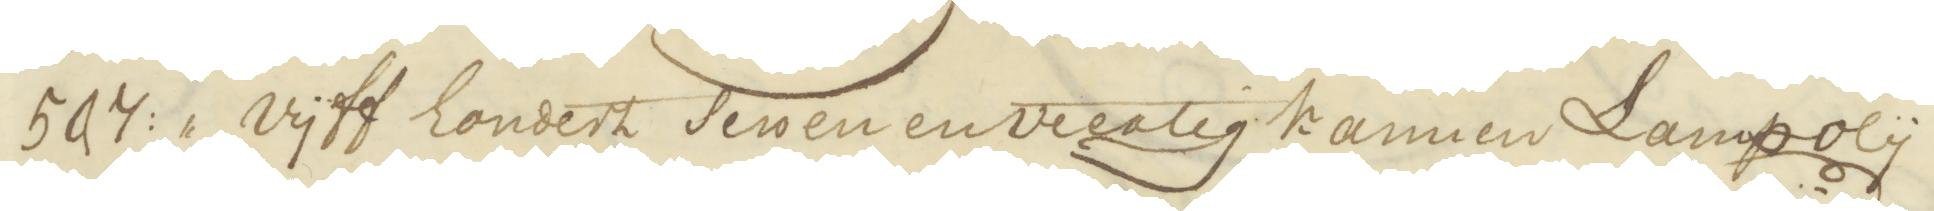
547: „ vijff hondert seven en veertig kannen Lampolij
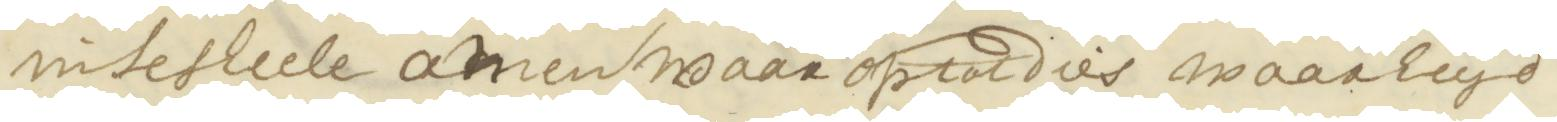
in ses heele amen waar op tot dies waarheijd
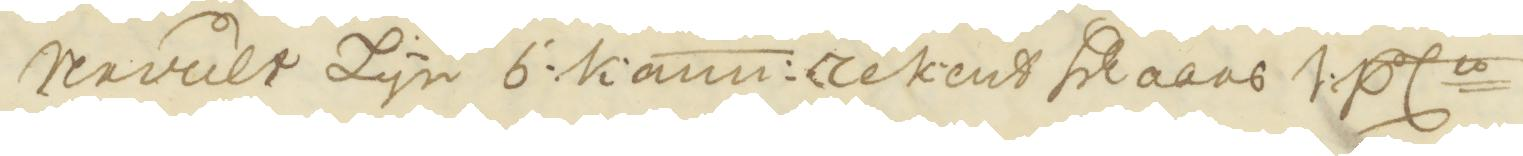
vervult zijn 6: kann: rekent schaars 1: pC=to
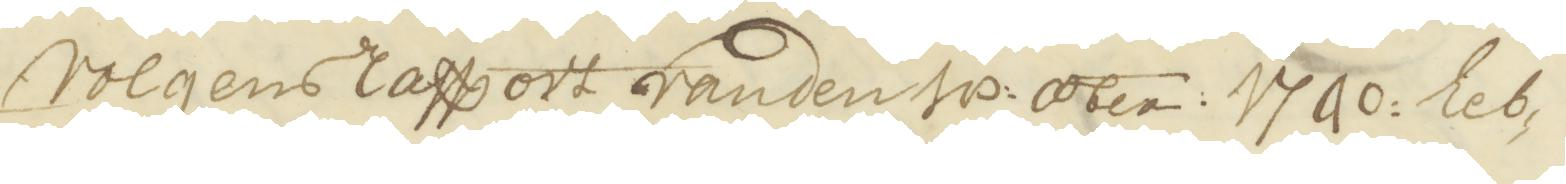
volgens rapport van den 18: 8ber: 1740: heb„
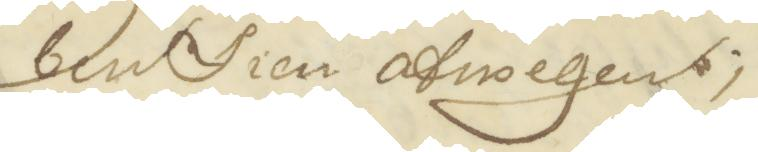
ben sien afwegens;
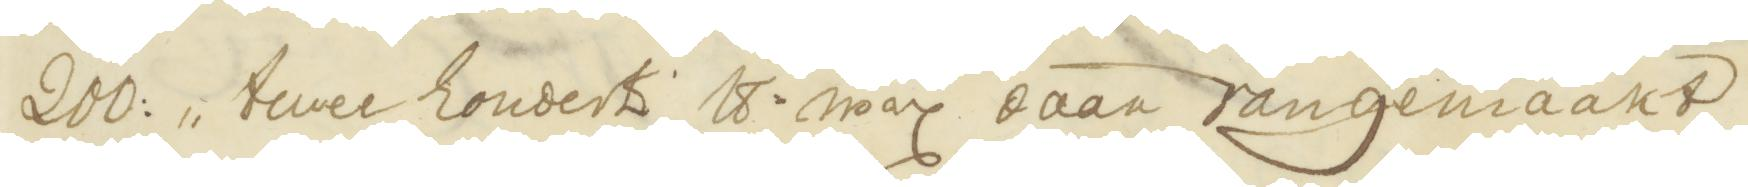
200: „ twee hondert lb: wax daar van gemaakt
